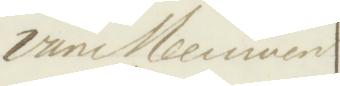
van Meeuwen
